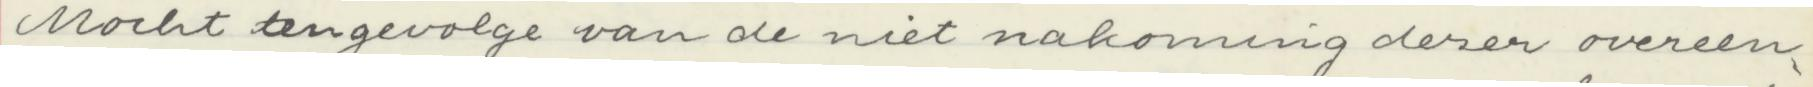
Mocht ten gevolge van de niet nakoming dezer overeen„
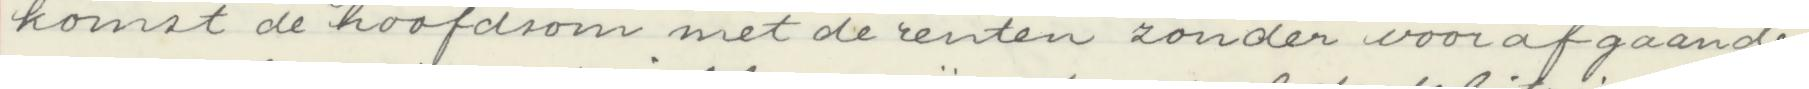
komst de hoofdsom met de renten zonder voor afgaande
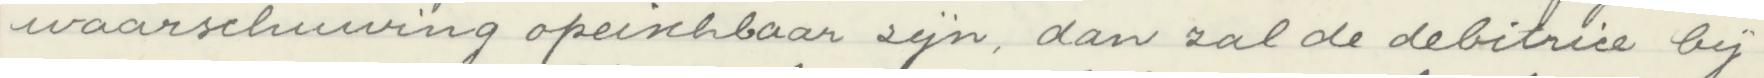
waarschuwing opeischbaar zijn, dan zal de debitrice bij
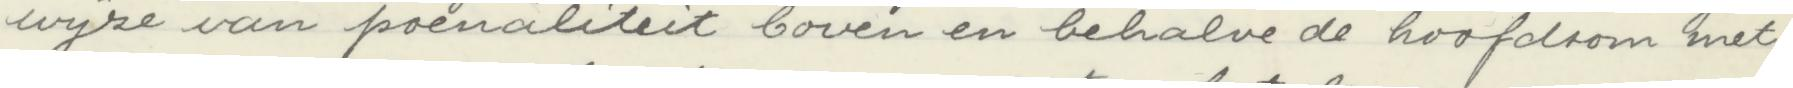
wijze van poenaliteit boven en behalve de hoofdsom met
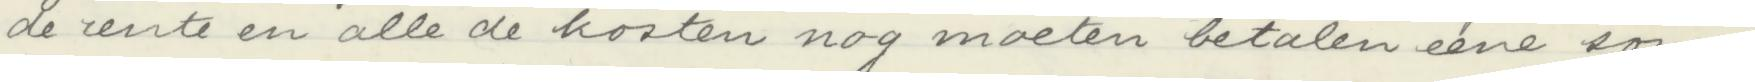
de rente en alle de kosten nog moeten betalen eene som
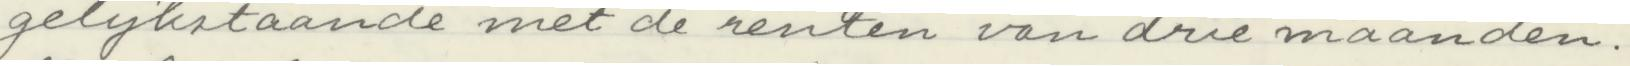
gelijkstaande met de renten van drie maanden.
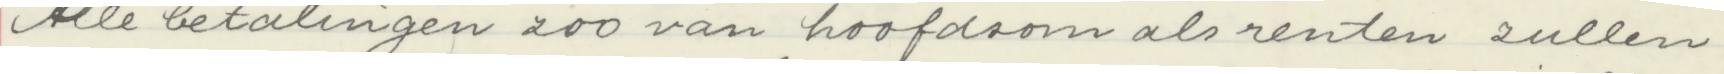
Alle betalingen zoo van hoofdsom als renten zullen
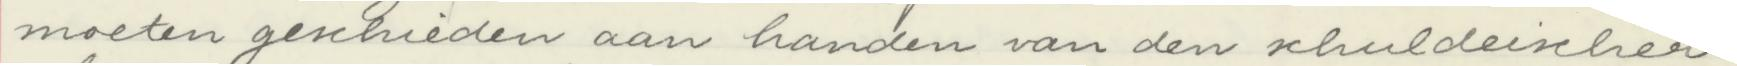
moeten geschieden aan handen van den shuldeischer
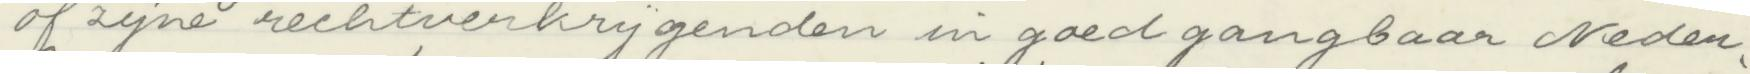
of zijne rechtverkrijgenden in goed gangbaar Neder
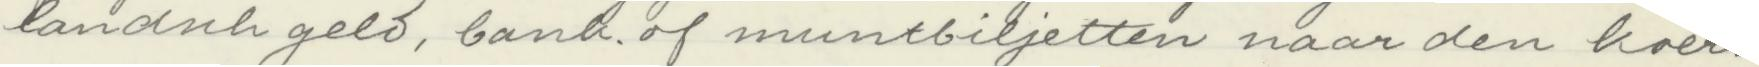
landsch geld, bank. of muntbiljetten naar den koers
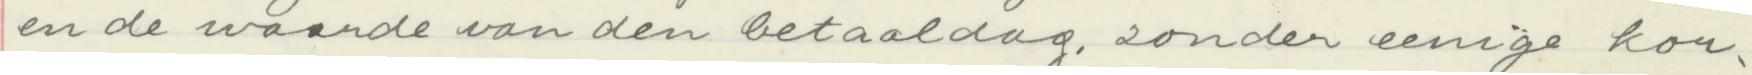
en de waarde van den betaaldag, zonder eenige kor
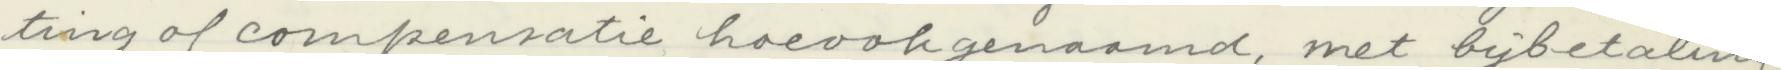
ting of compensatie hoe ook genaamd, met bijbetaling
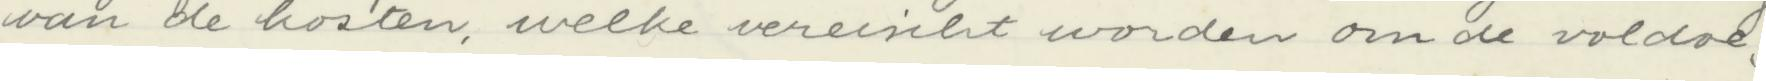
van de kosten, welke vereischt worden om de voldoe,
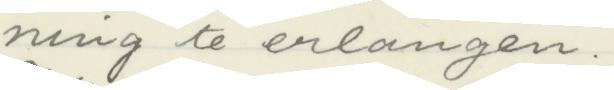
ning te erlangen.
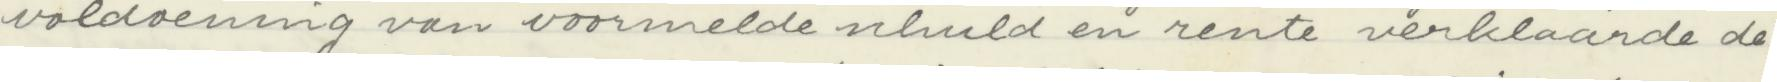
voldoening van voormelde schuld en rente verklaarde de
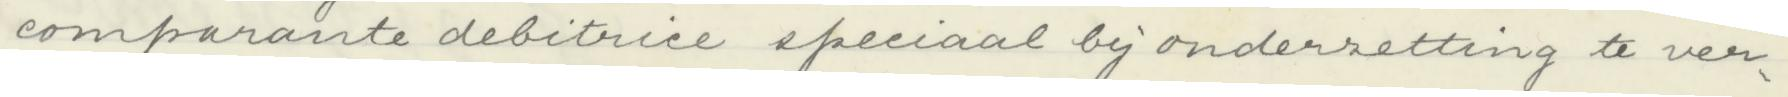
comparante debitrice speciaal bij onderzetting te ver„
